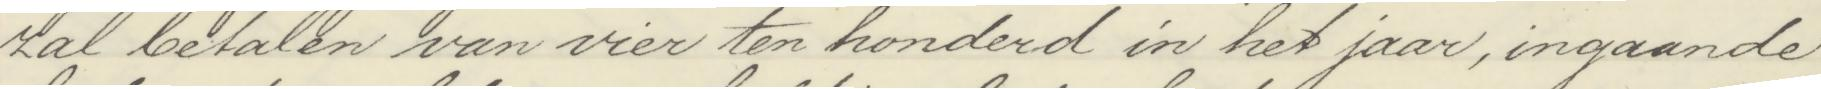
zal betalen van vier ten honderd in het jaar, ingaande
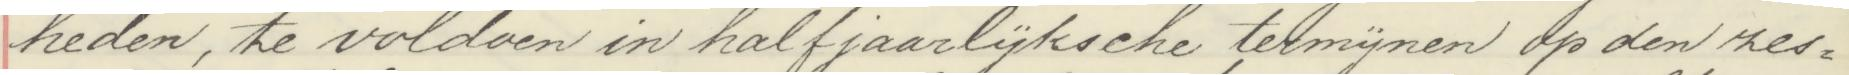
heden, te voldoen in half jaarlijksche termijnen op den zes=
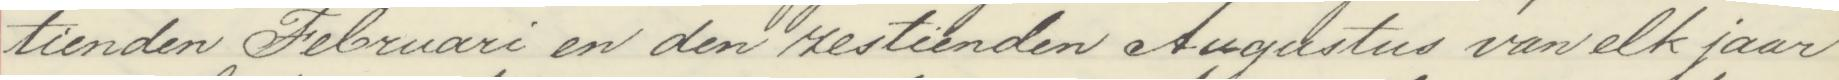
tienden Februari en den zestienden Augustus van elk jaar
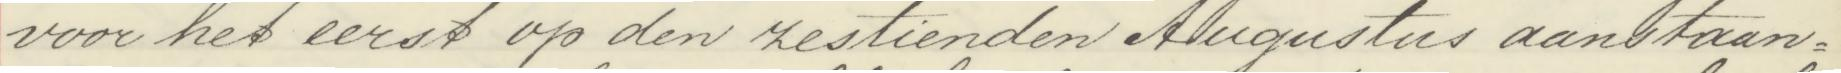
voor het eerst op den zestienden Augustus aanstaan=
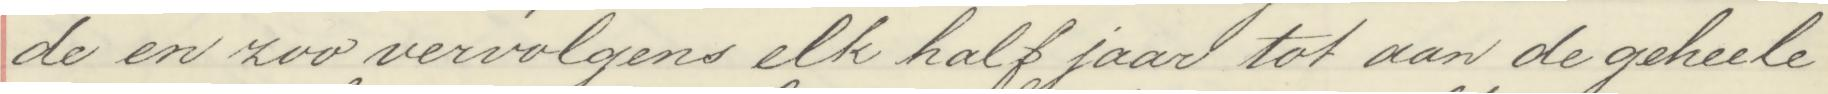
de en zoo vervolgens elk half jaar tot aan de geheele
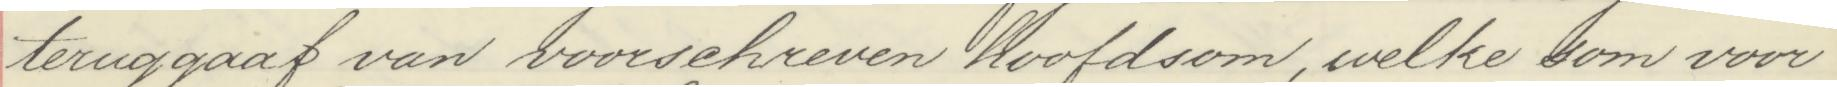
teruggaaf van voorschreven hoofdsom, welke som voor
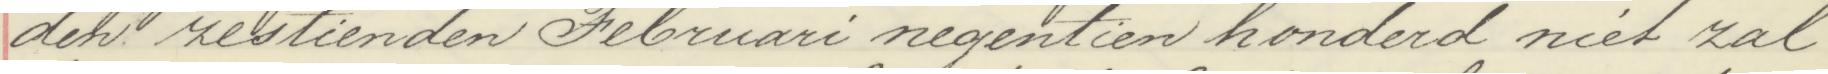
den zestienden Februari negentien honderd niet zal
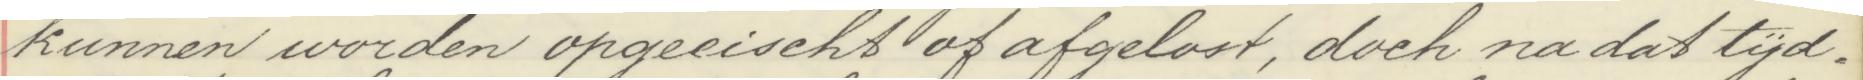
kunnen worden opgeeischt of afgelost, doch na dat tijd=
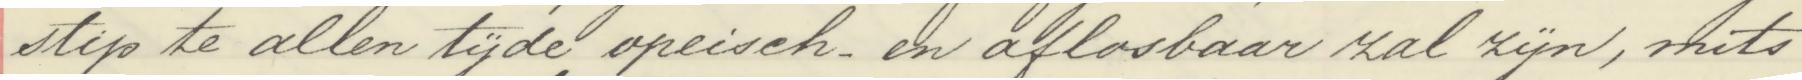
stip te allen tijde opeisch- en aflosbaar zal zijn, mits
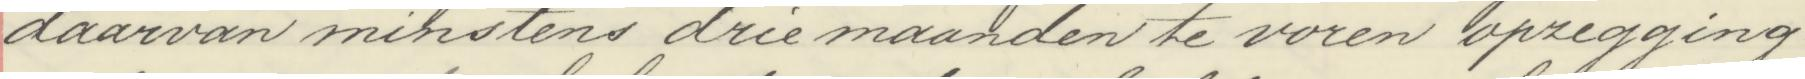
daarvan minstens drie maanden te voren opzegging
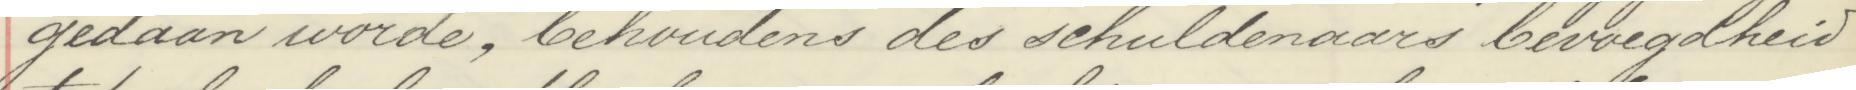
gedaan worde, behoudens des schuldenaars bevoegdheid
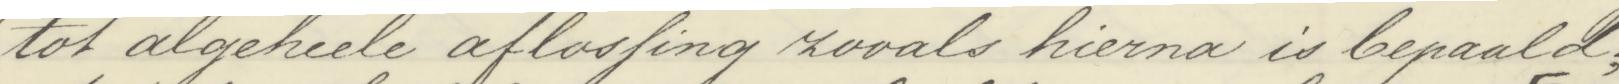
tot algeheele aflossing zooals hierna is bepaald
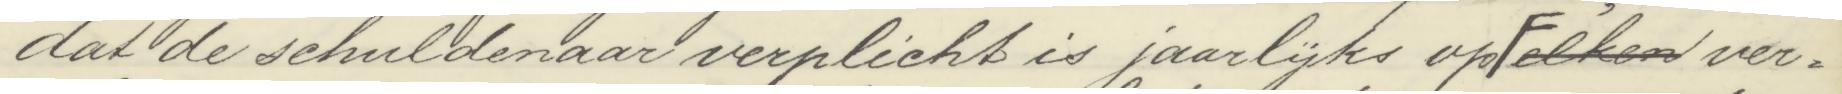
dat de schuldenaar verplicht is jaarlijks op ¶elken ver=
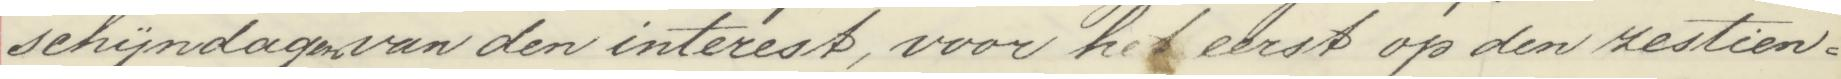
schijndag en van den interest, voor het eerst op den zestien=
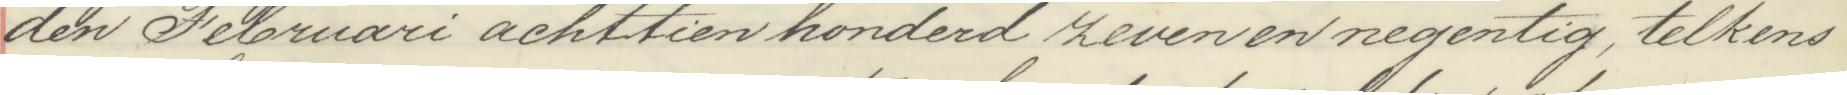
den Februari achttien honderd zeven en negentig, telkens
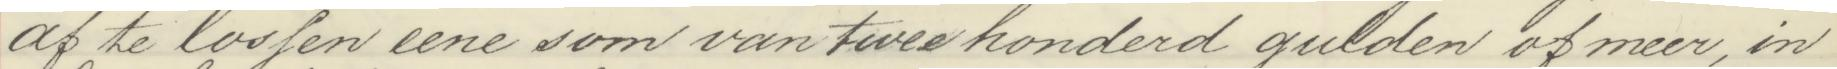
af te lossen eene som van twee honderd gulden of meer, in
